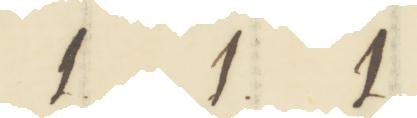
1. 1. 1.
